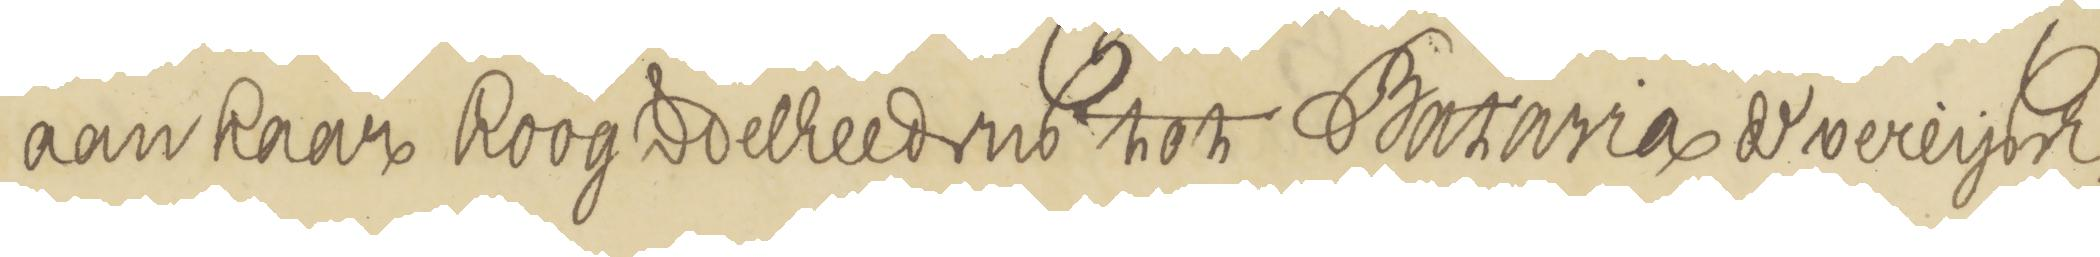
aan haar hoog Edelheedens tot Batavia de vereijsch„
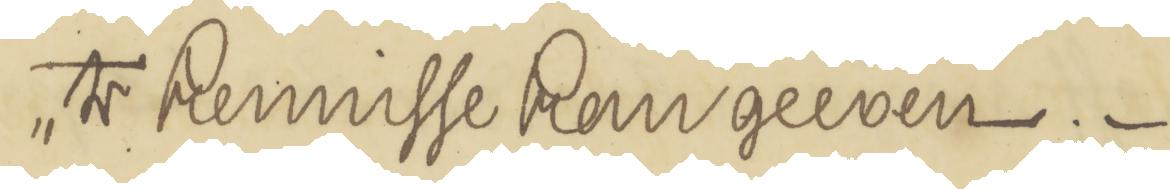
„te kennisse kan geeven. —
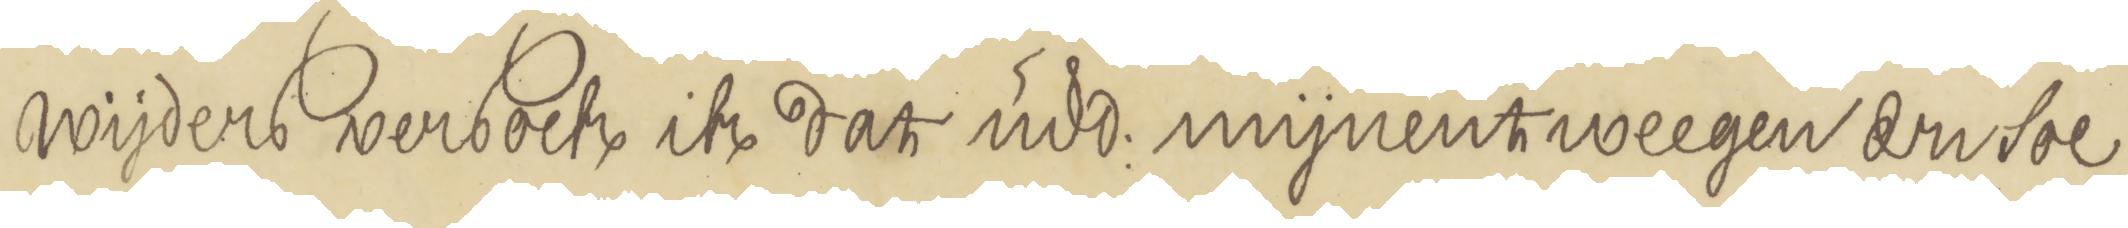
wijders versoek ik dat uEd: mijnent weegen den soe
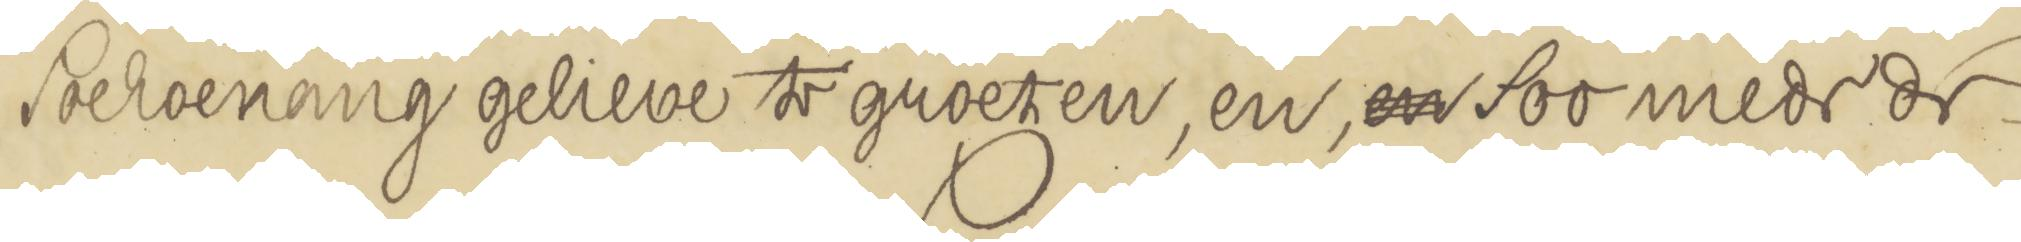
soehoenang gelieve te groeten, en, en soo mede de
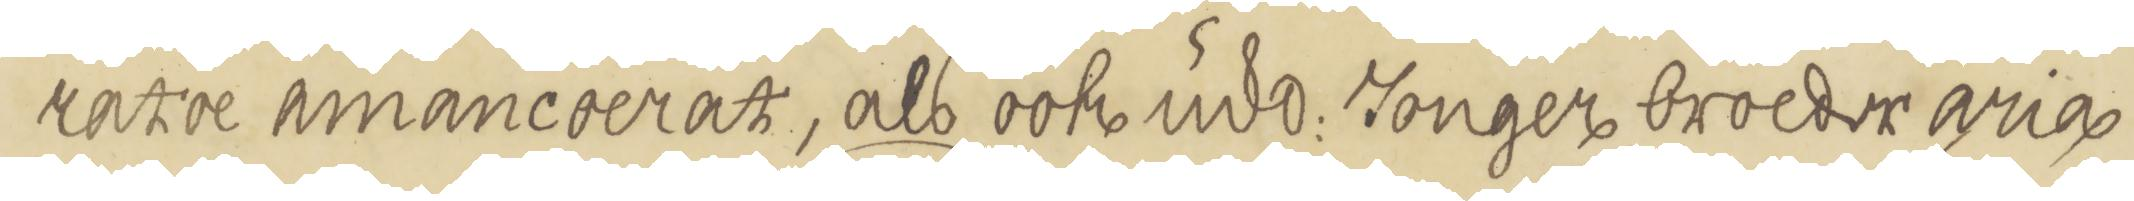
ratoe amancoerat, als ook uEd: Jonger broeder aria
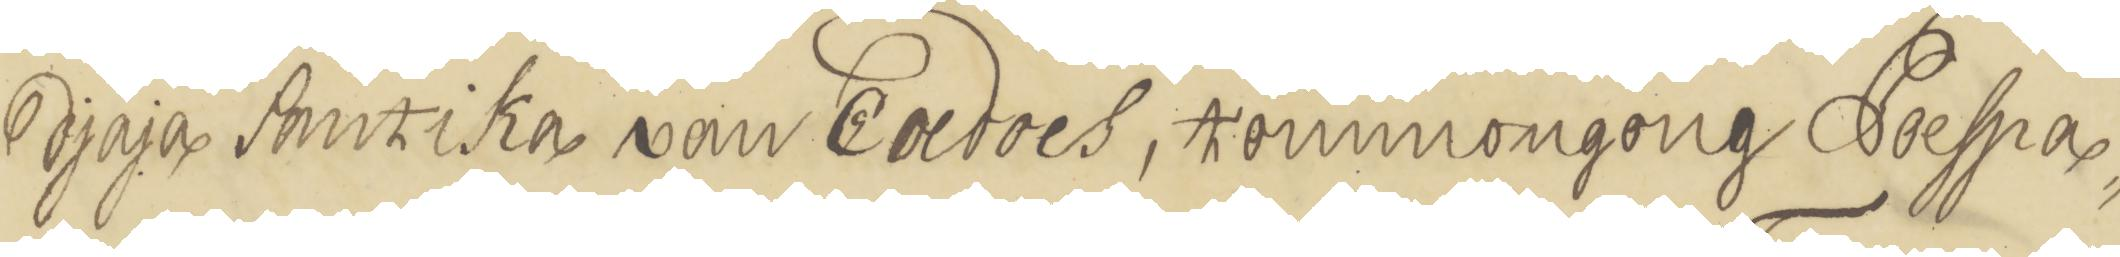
djaja santika van coedoes, tommongong Poespa
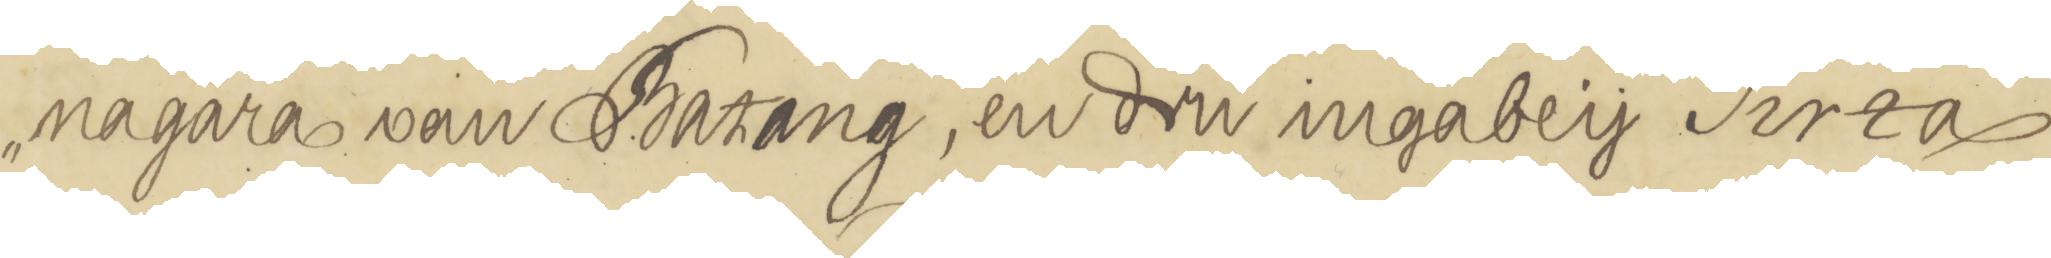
nagara van Batang, en den ingabeij Tirta
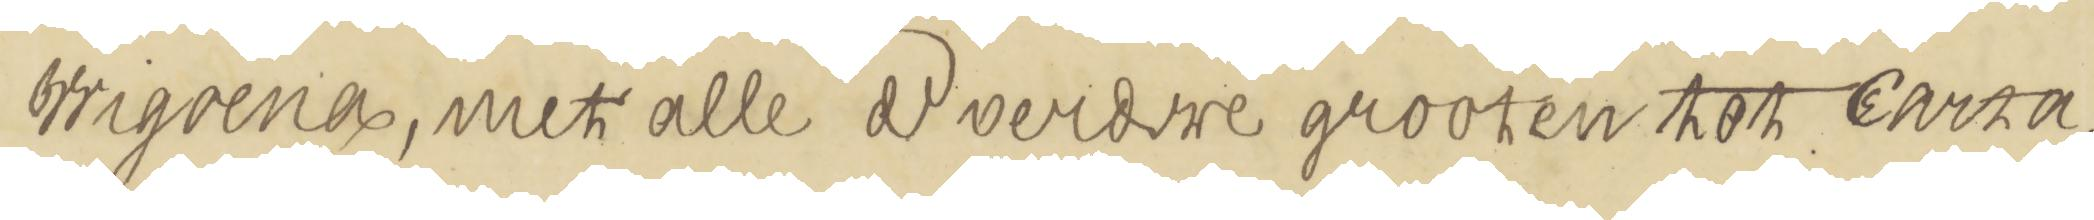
wigoena, met alle de verdere grooten tot carta
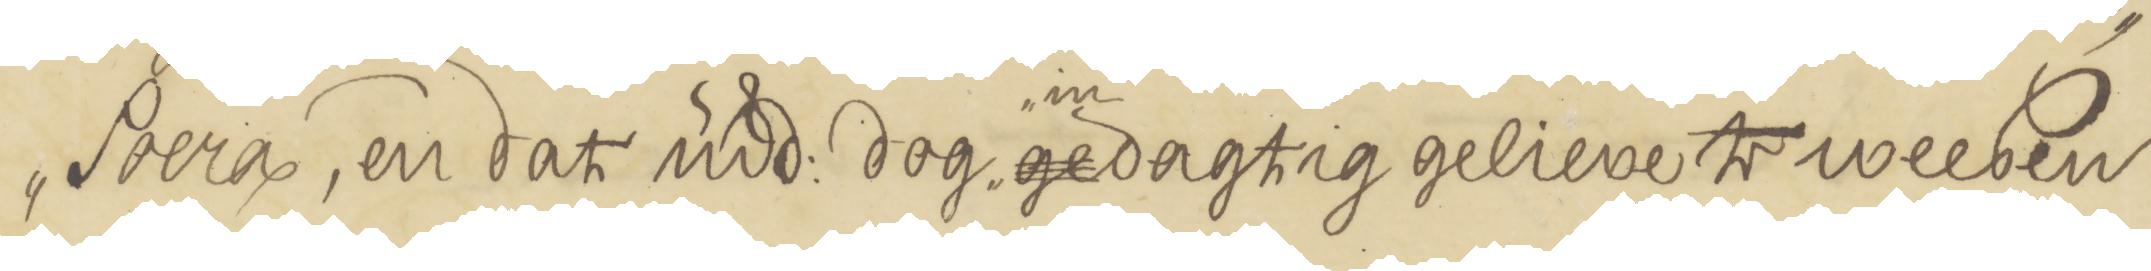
„soera, en dat uEd: dog „ingedagtig gelieve te weesen
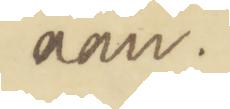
aan.
